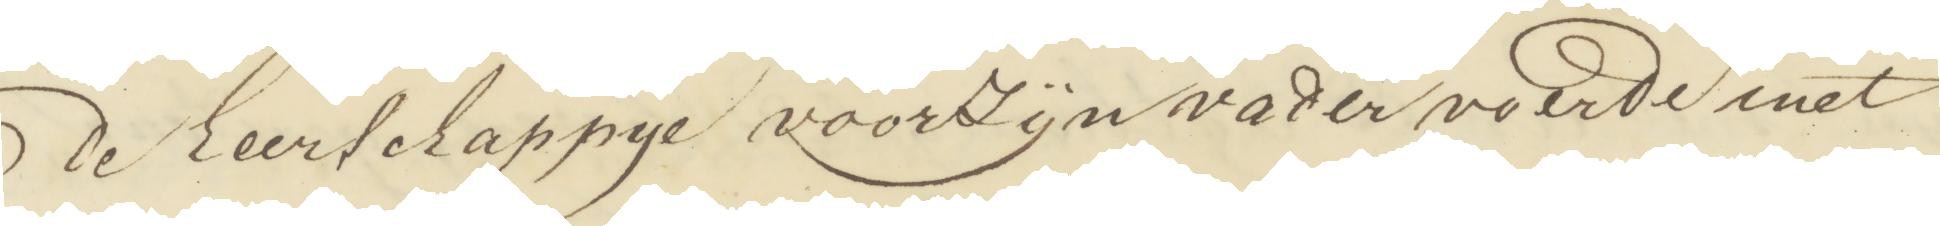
de heerschappije voorzijn vader voerde met
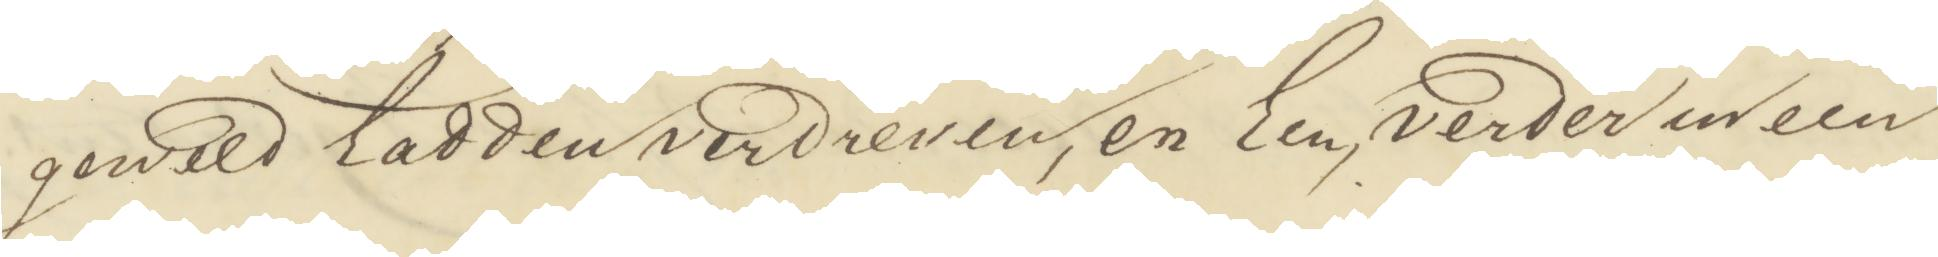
geweld hadden verdreven, en hem verder in een
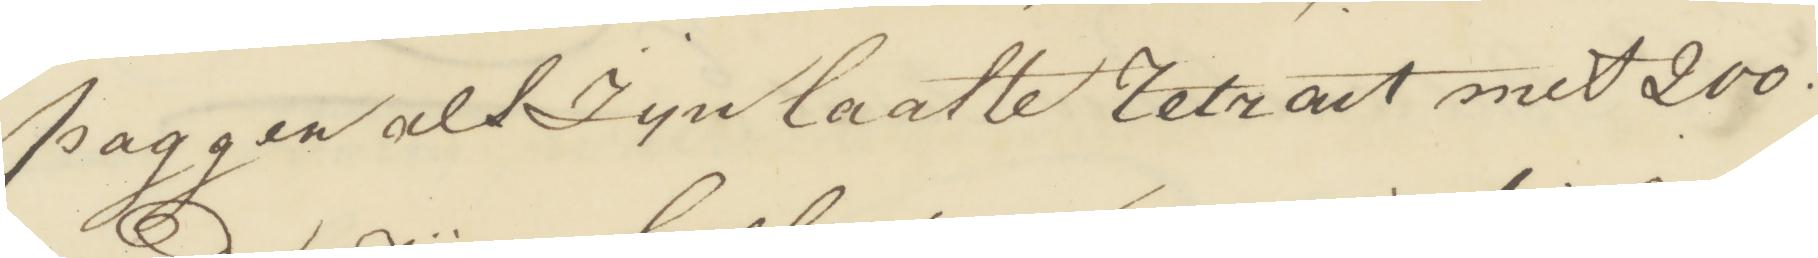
paggen als zijn laaste retrait met 200.
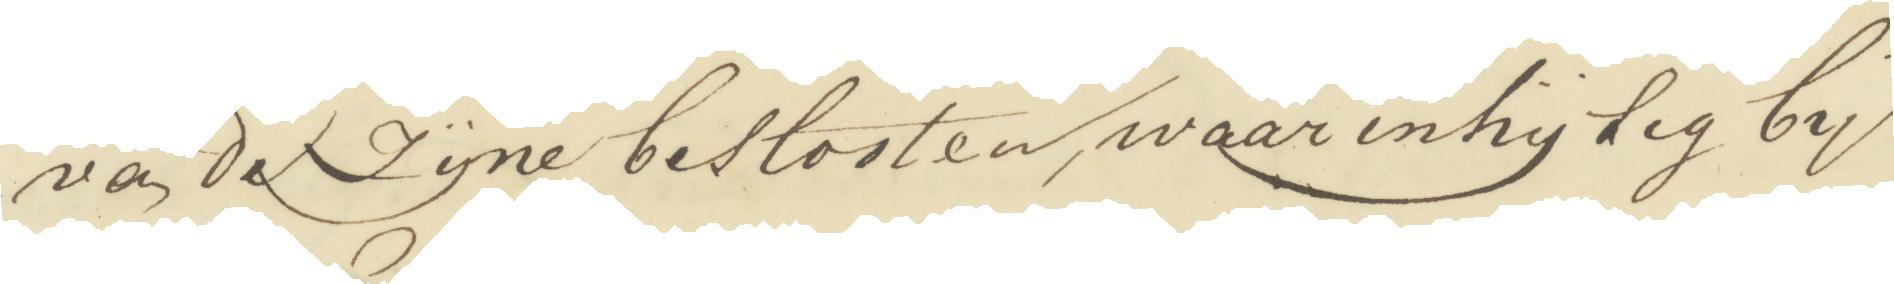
van de zijne beslooten, waar inhij sig bij
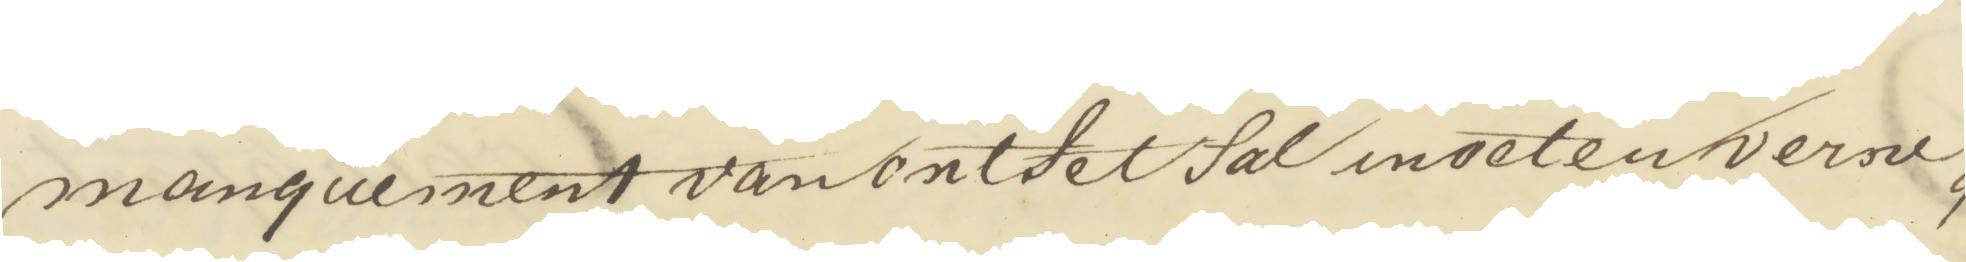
manquement van ontset sal moeten verne
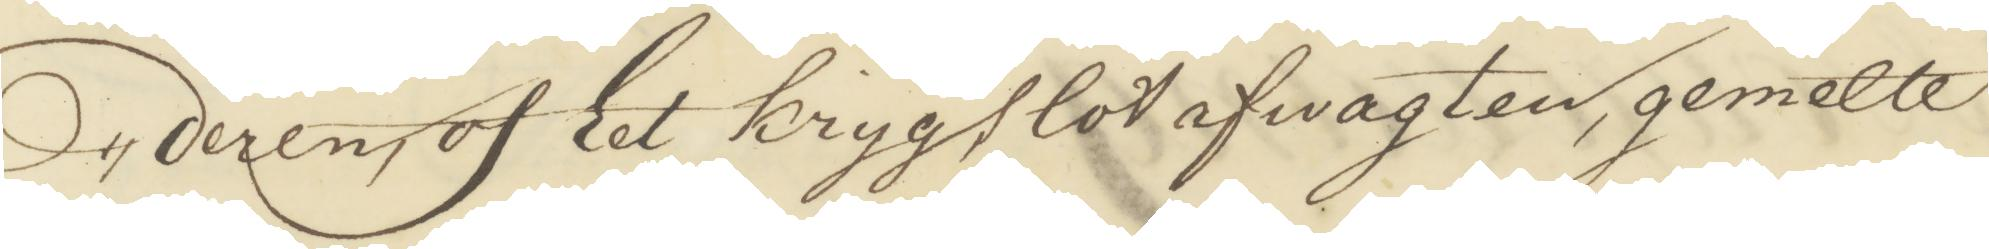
„deren, of het krijgslot afwagten, gemelte
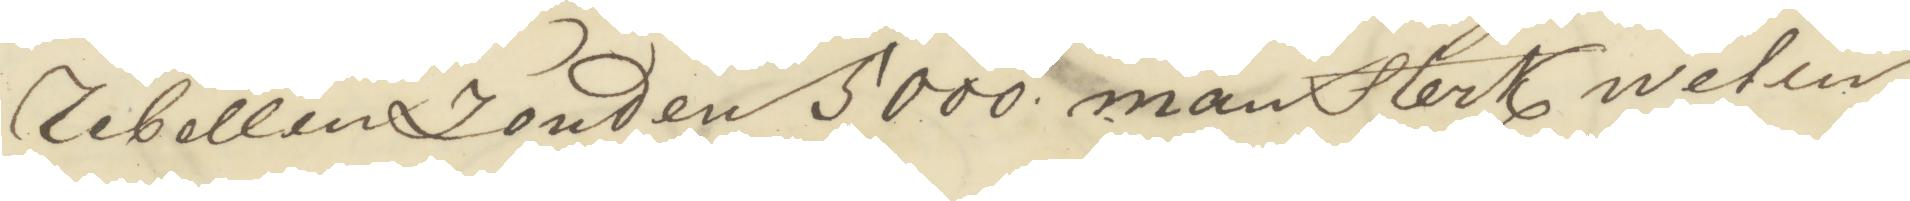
rebellen zouden 5000. man sterk wesen,
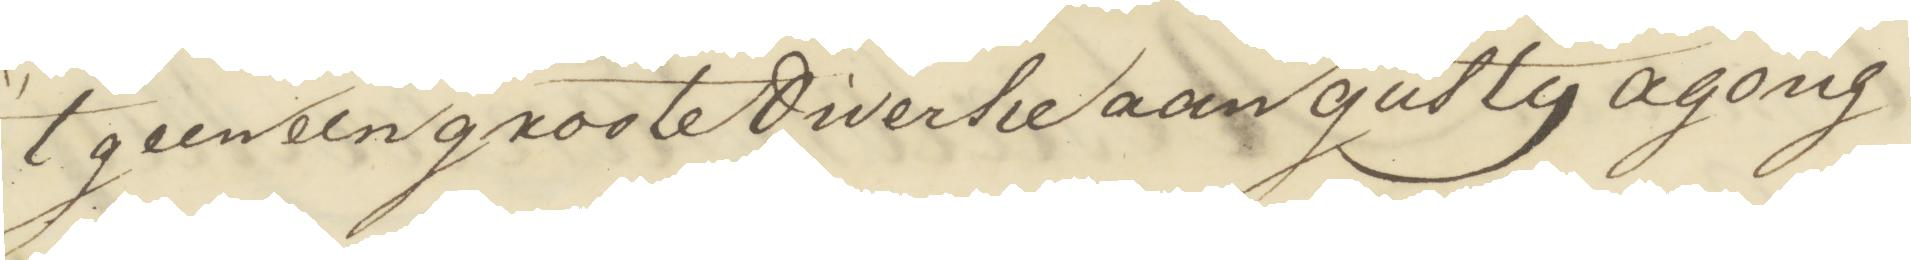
’t geen een groote diversie aan gustij agong
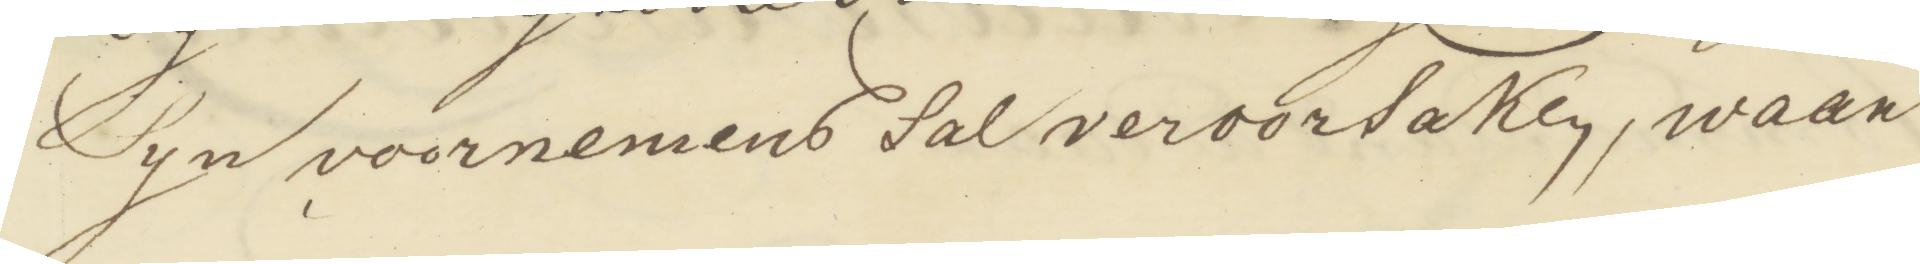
sijn voornemens sal veroorsaken, waar
